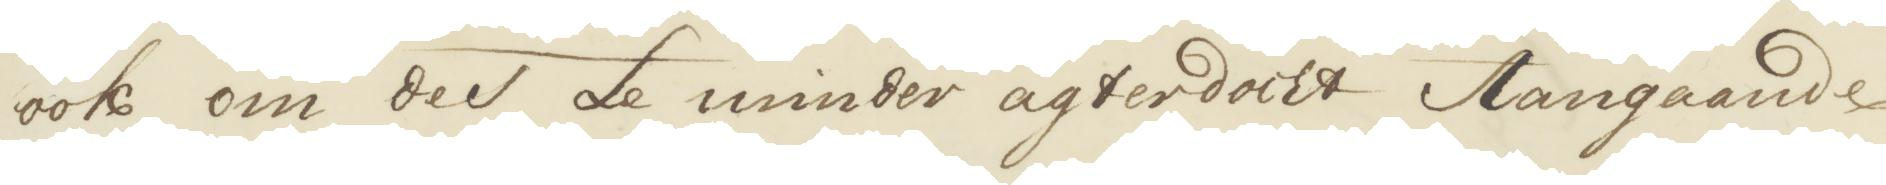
ook om des te minder agterdocht Aangaande
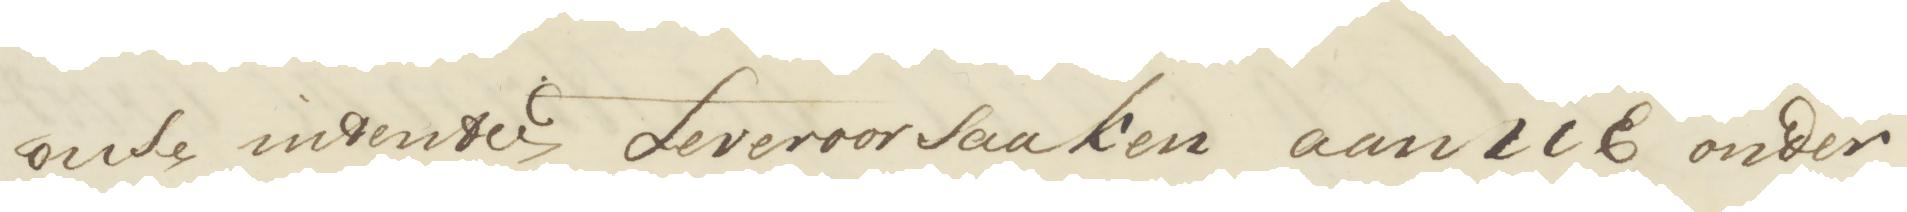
onse indentien teveroorsaaken aan UE onder
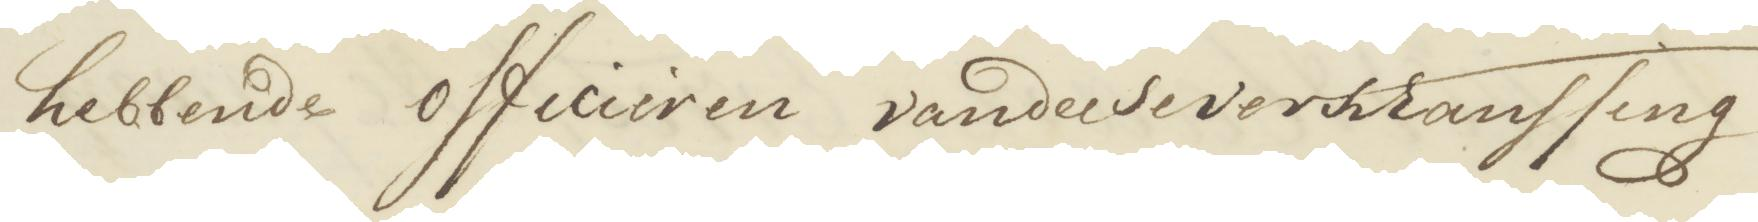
hebbende officieren vandeese verschanssing
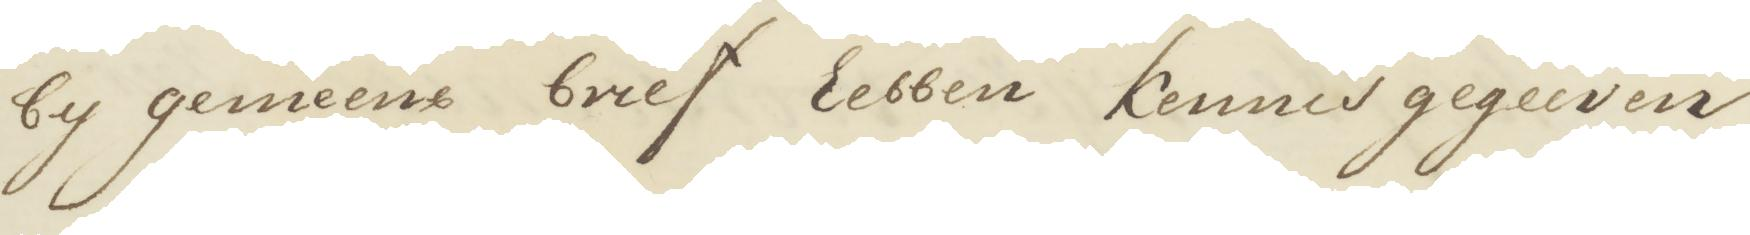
by gemeene brief hebben kennis gegeeven
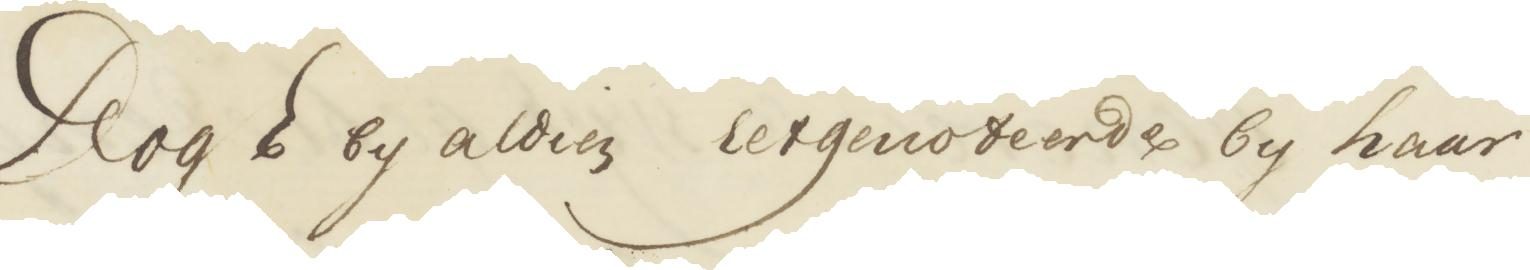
Dog E by aldien hetgenoteerde by haar
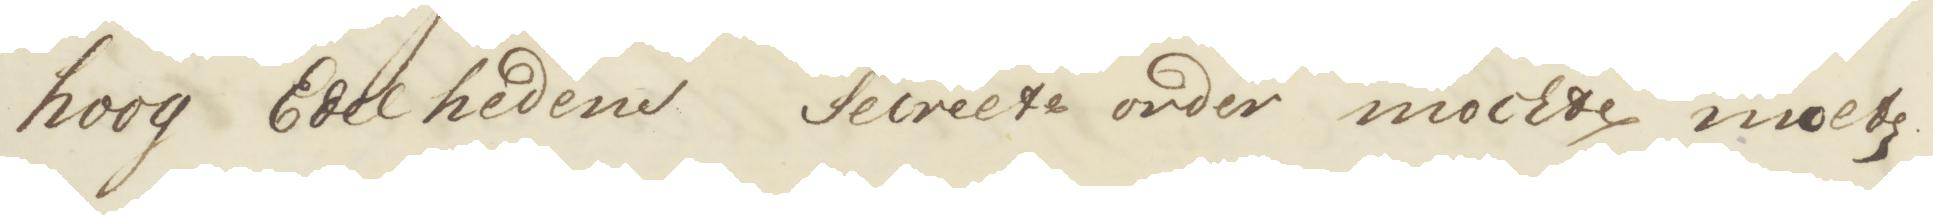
hoog Edelhedens secreete order mochte moeten
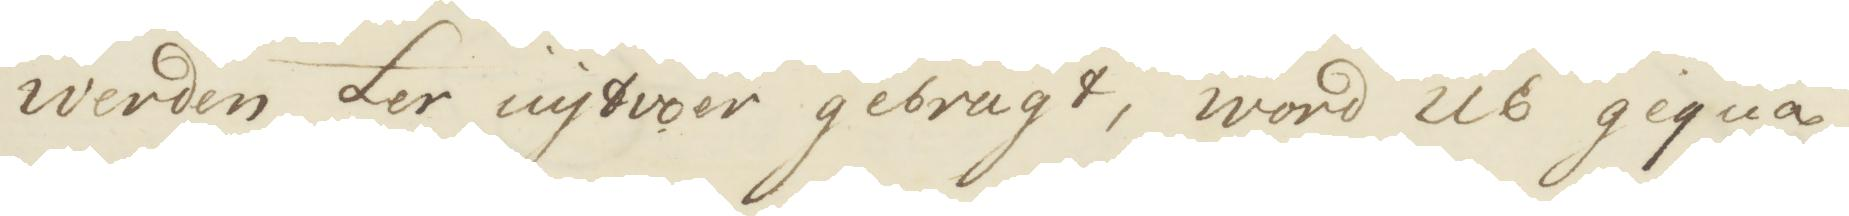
werden ter uijtvoer gebragt, word UE gequa
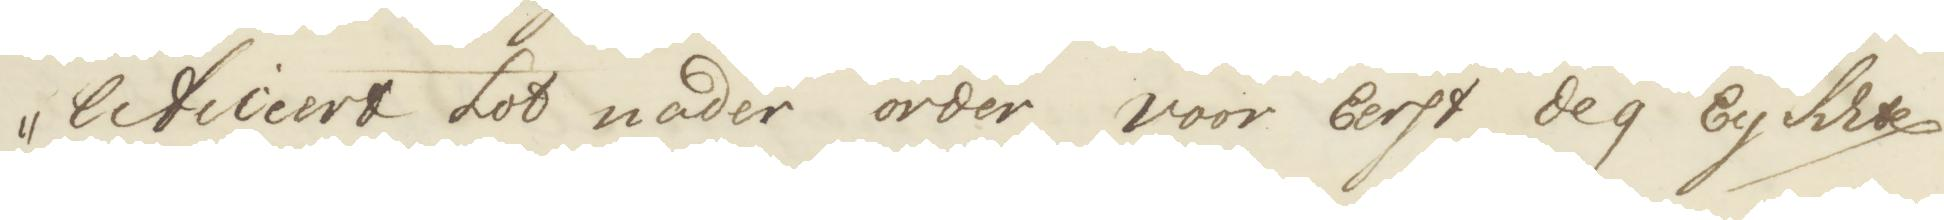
„lificeert tot nader order voor Eerst de g' Eijschte
